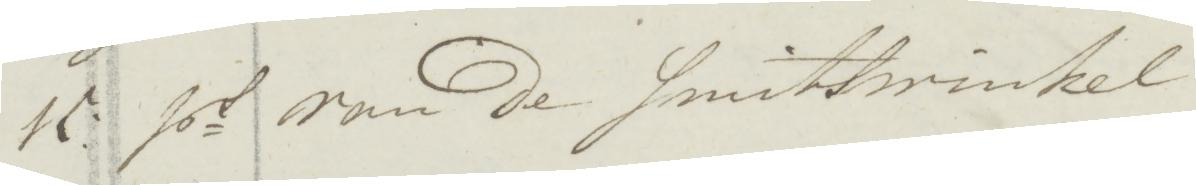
15: p=s van de smitswinkel
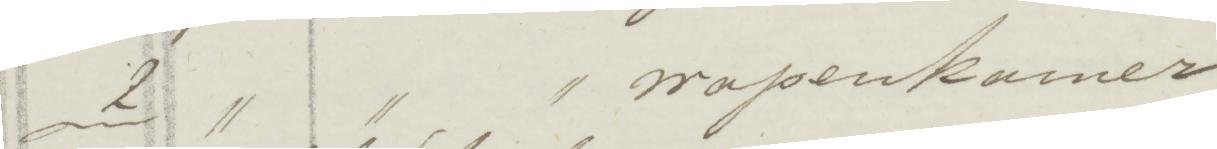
2 „ „ „ wapenkamer
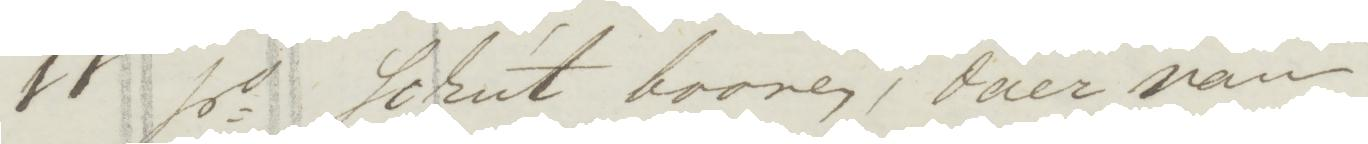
11 p:s schut booren, daer van
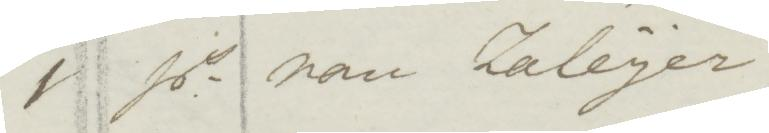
1 p-s van zaleijer
